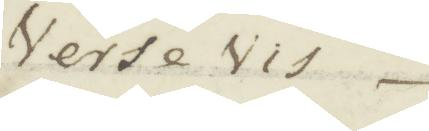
Verse vis -
